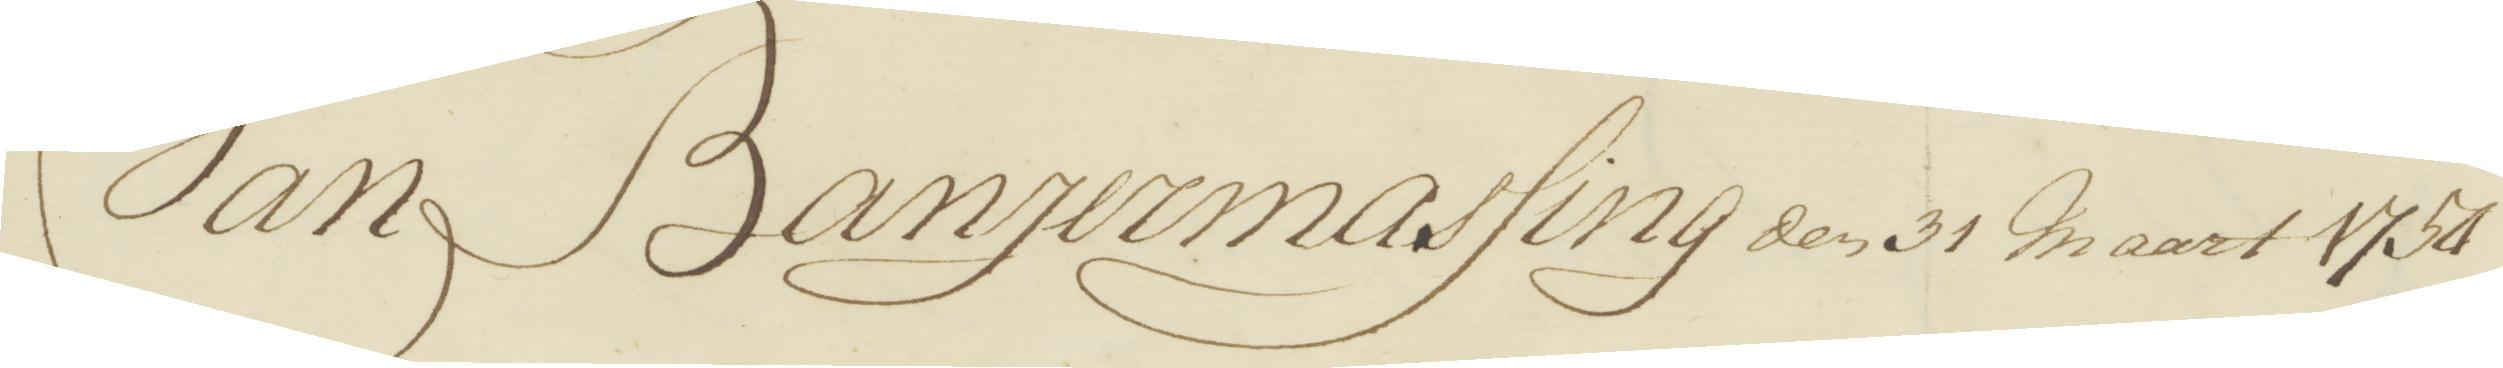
Van Banjermassing den 31 maart 1754
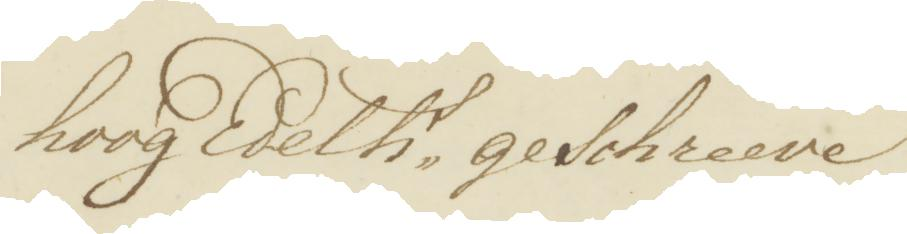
hoog Edelh„s geschreeve
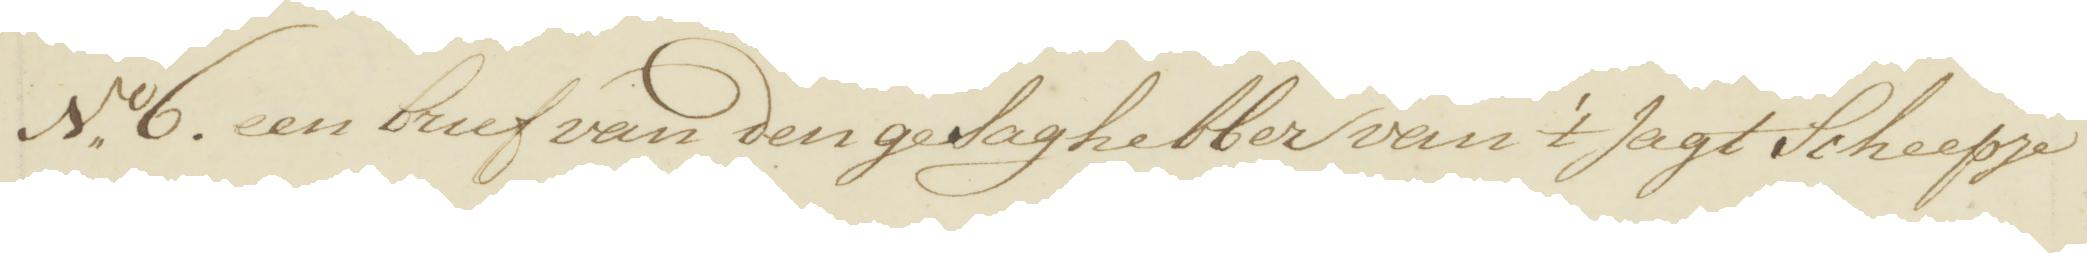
N„o 6. een brief van den gesaghebber van ’t Jagt scheepje
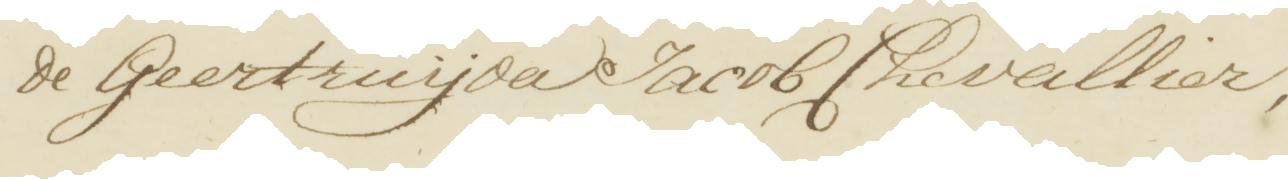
de Geertruijda Iacob Chevallier
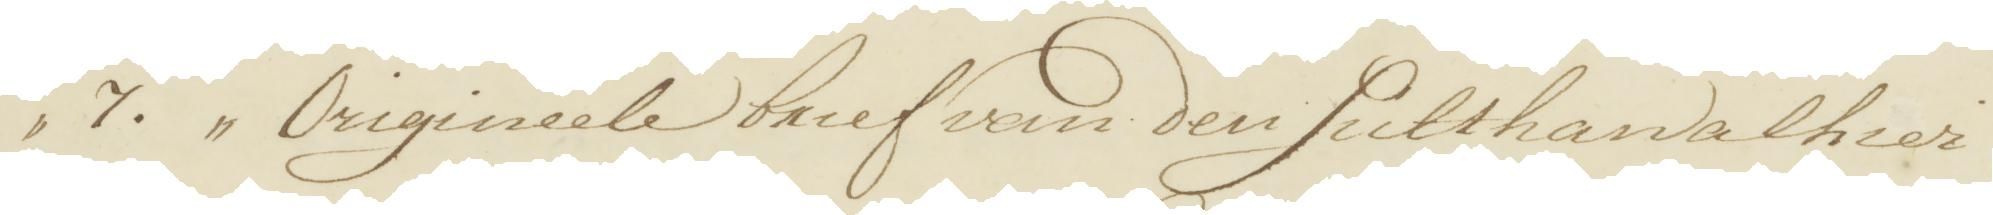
„ 7. „ Origineele brief van den sulthan alhier
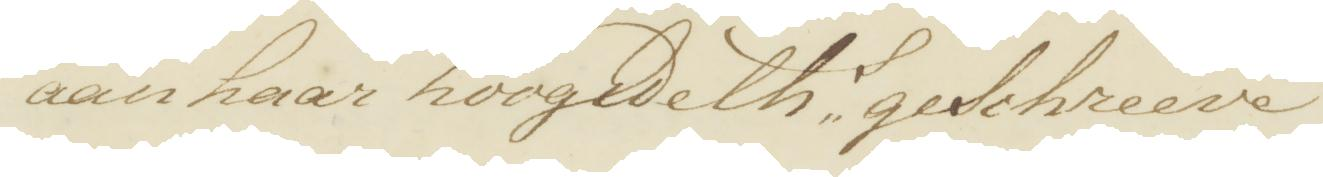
aan haar hoogEdelh„s geschreeve
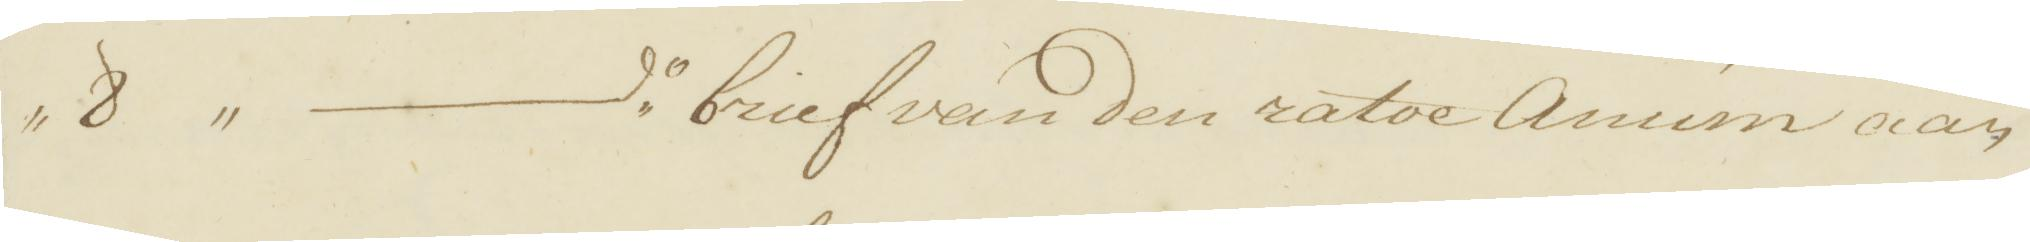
„ 8 „ _„o brief van den ratoe Anum aan
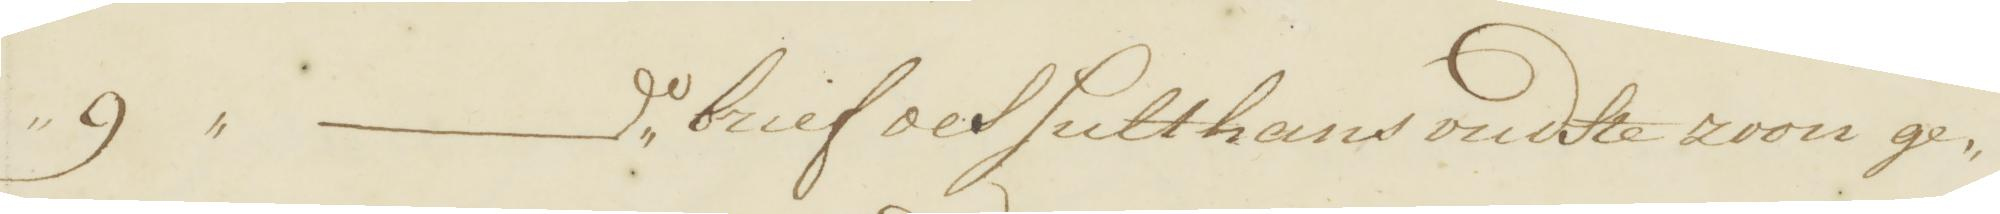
„ 9 „ _„o brief des sulthans oudste zoon ge„
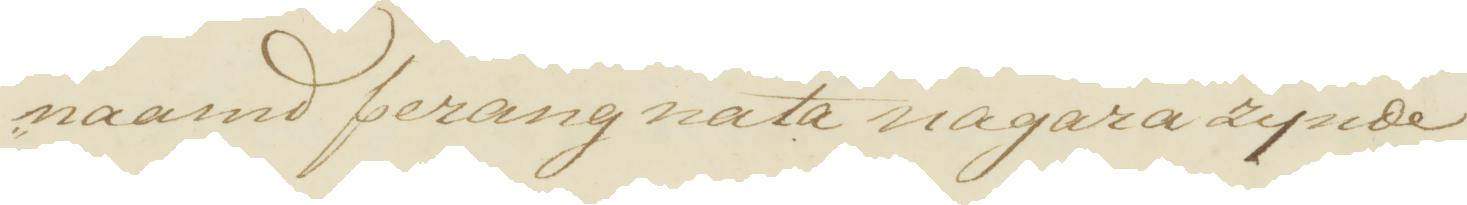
„naamd perang nata nagara zynde
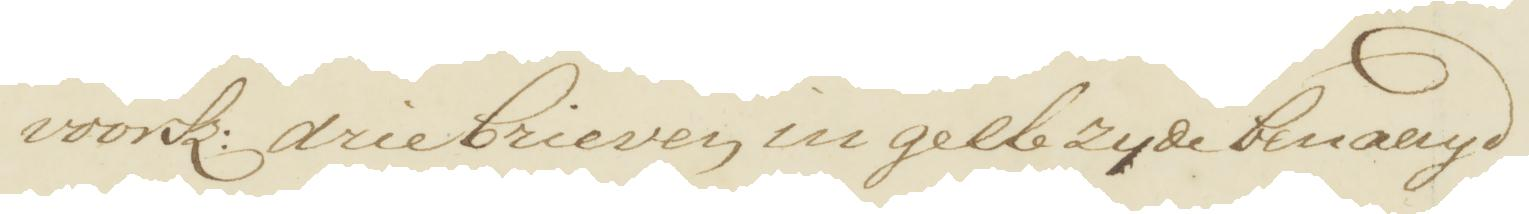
voork: drie brieven in geele zyde benaayd
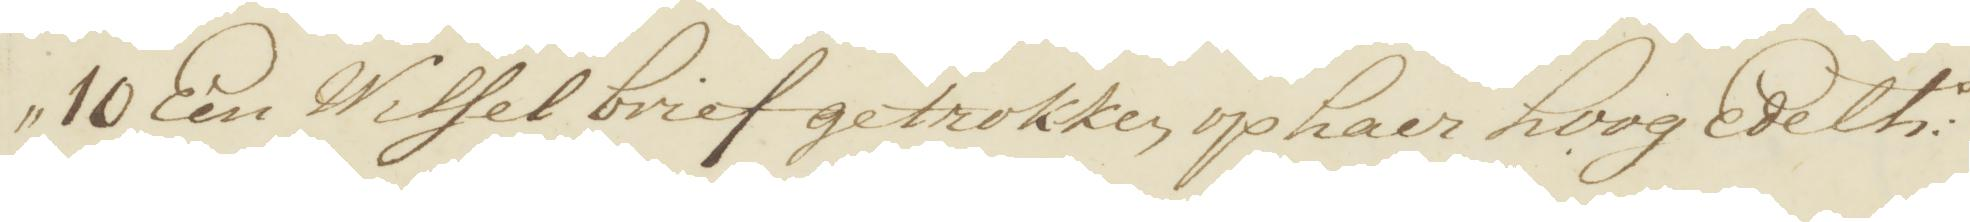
„ 10 Een Wissel brief getrokken op haer hoog Edelh:s
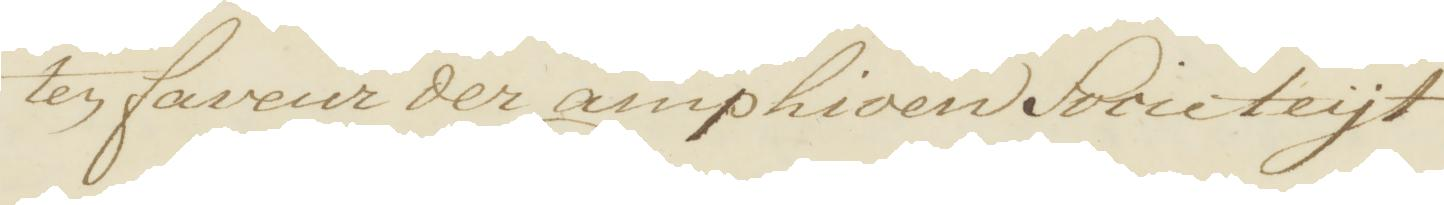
ten faveur der amphioen societeijt
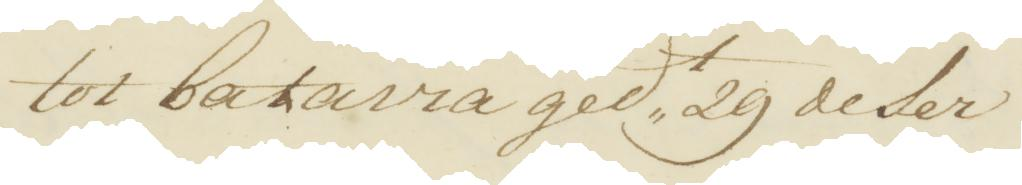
tot batavia ged„t 29 deser
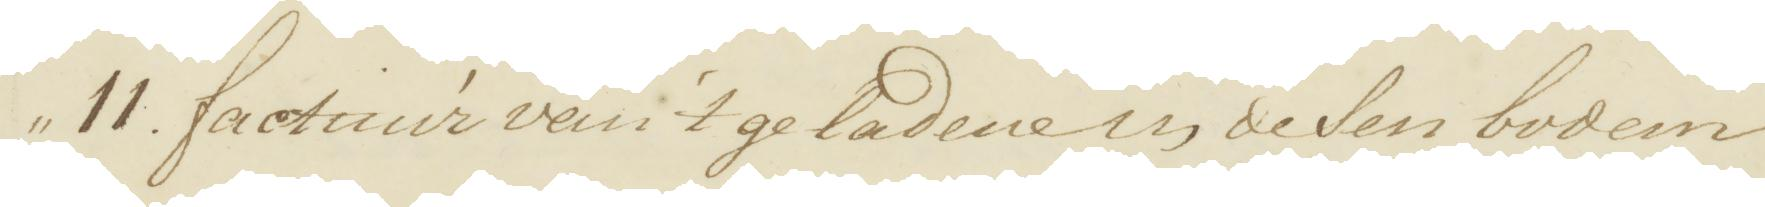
„ 11. factuur van ’t geladene in desen bodem
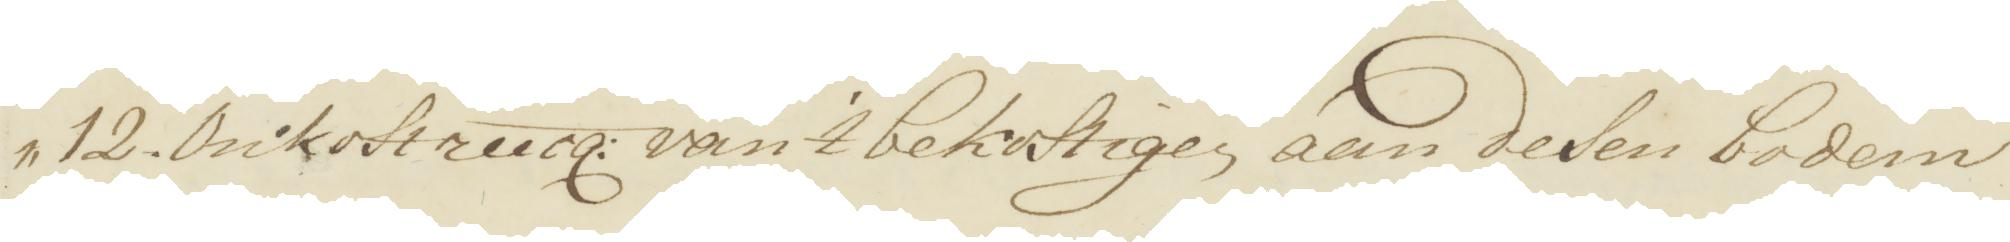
„ 12. Onkostreecq: van ’t bekostigen aan desen bodem
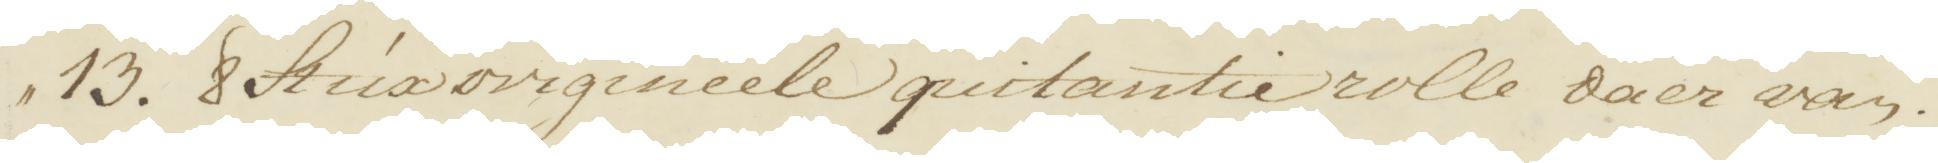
„ 13. 8 stux origineele quitantie rolle daer van.
